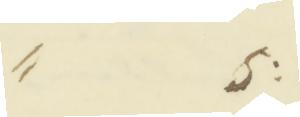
„ 5:
